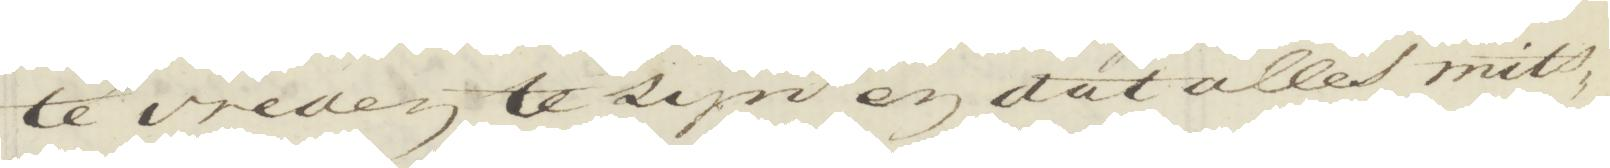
te vreden te zyn en dat alles mits„
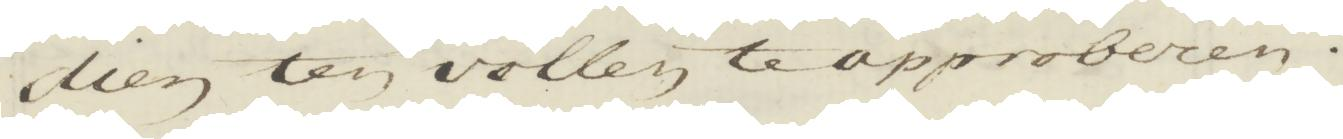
dien ten vollen te approberen
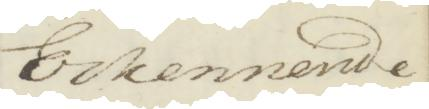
Erkennende
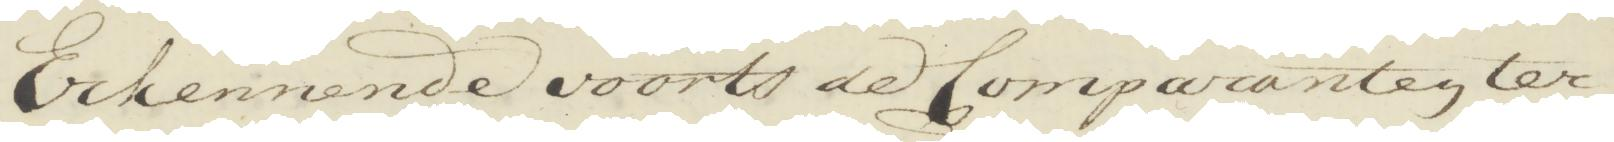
Erkennende voorts de Comparanten ter
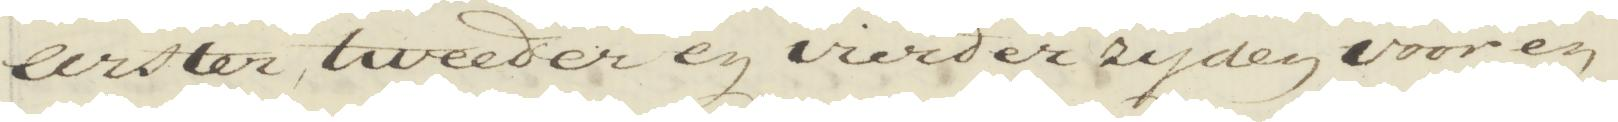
Eerster, tweeder en vierder zijden voor en
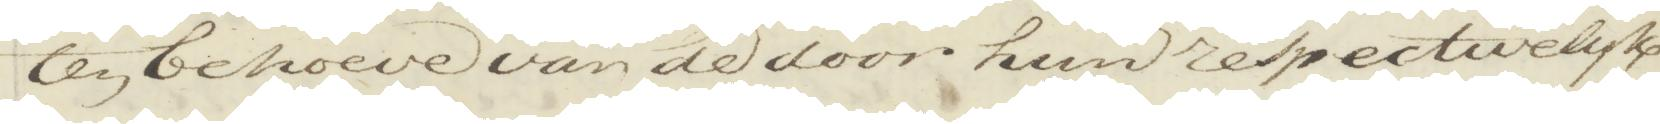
ten behoeve van de door hun respectivelyk
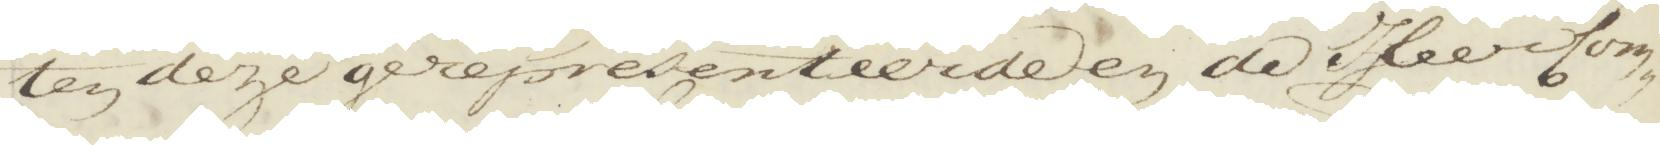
ten deze gerepresenteerde en de Heer Com
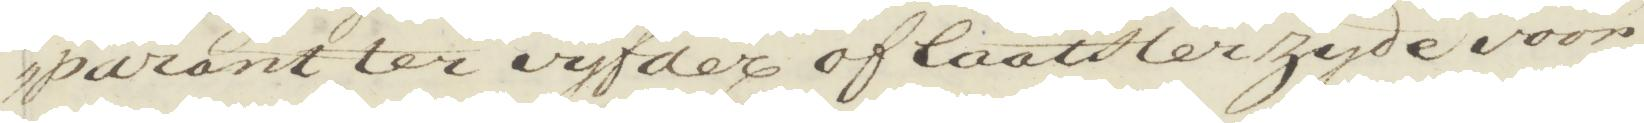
parant ter vyfder of laatster zyde voor
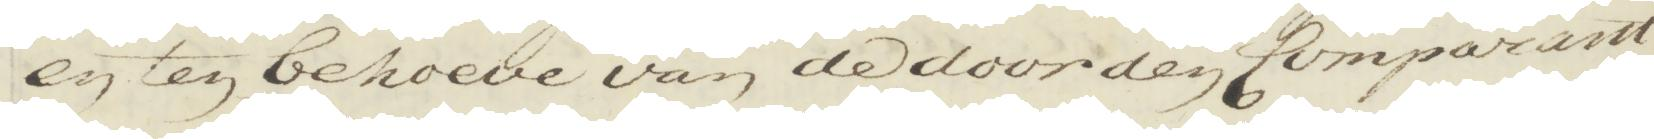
en ten behoeve van de door den Comparant
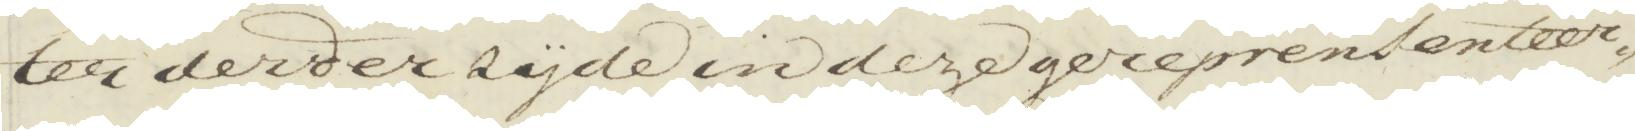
ter derder zijde in deze gereprensenteer
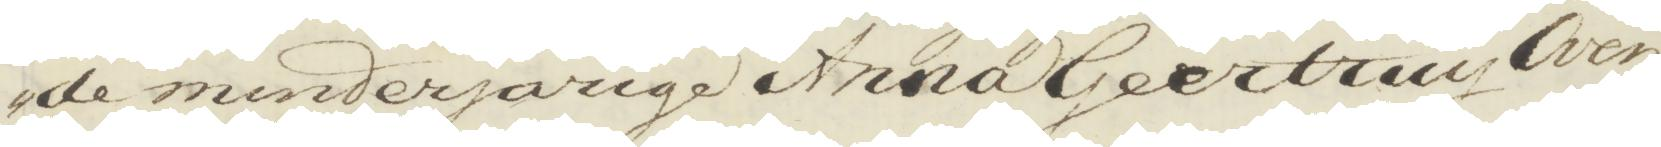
„de minderjarige Anna Geertruij Oven
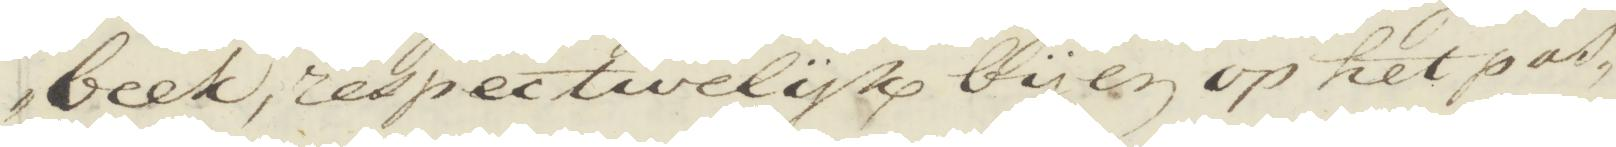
„beek, respectivelijk bij en op het pas„
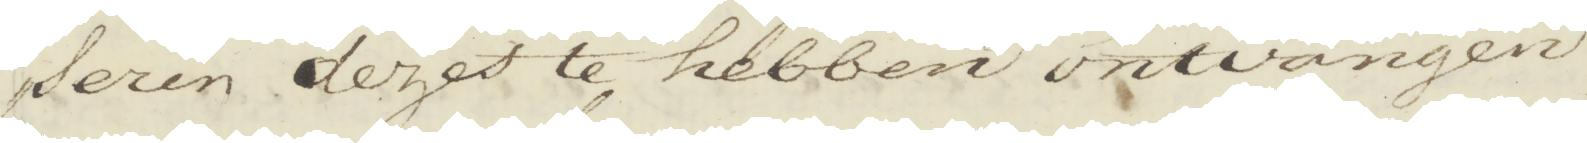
„seren dezes te hebben ontvangen
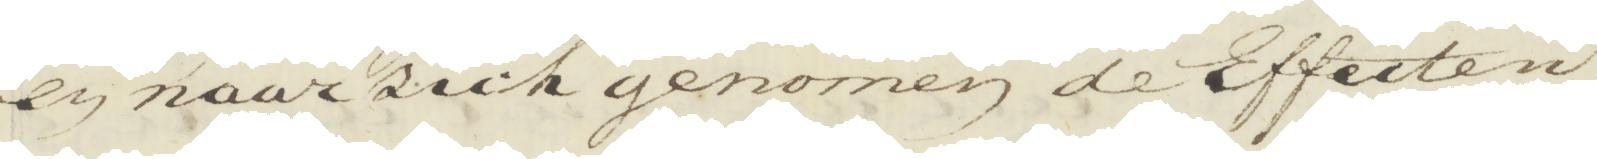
en naar zich genomen de Effecten
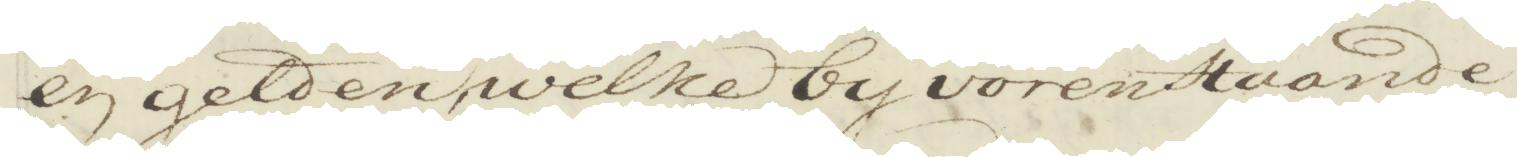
en gelden, welke by vorenstaande
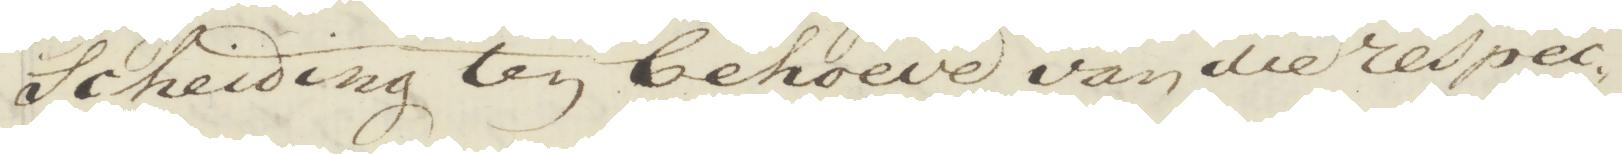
scheiding ten behoeve van die respec„
